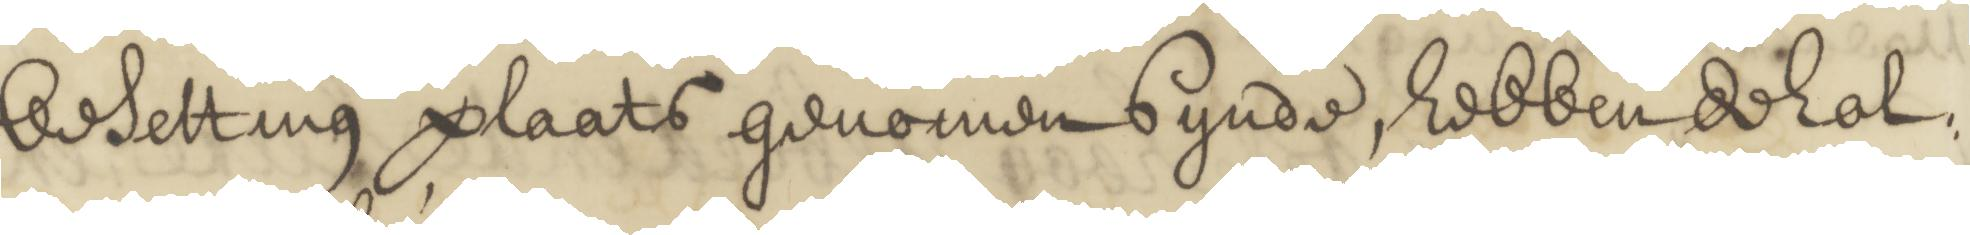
besetting plaats genomen synde, hebben de hol„
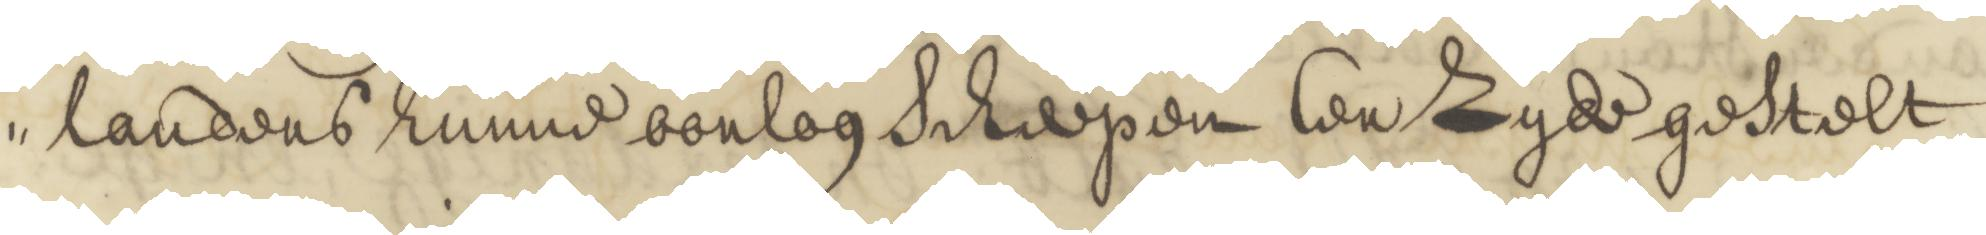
„landers hunne oorlog scheepen ter zijde gestelt
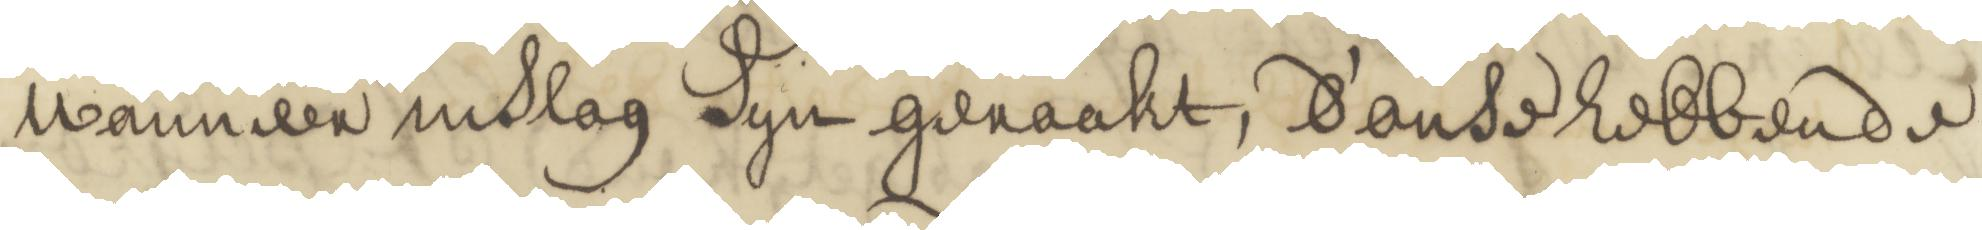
wanneer inslag sijn geraakt, d'onse hebbende
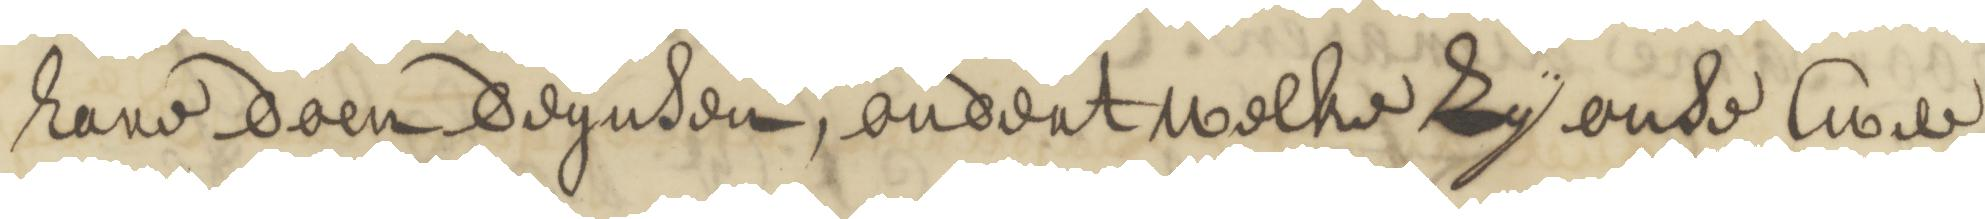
hare doen deijnsen, onder 't welke zij onse twee
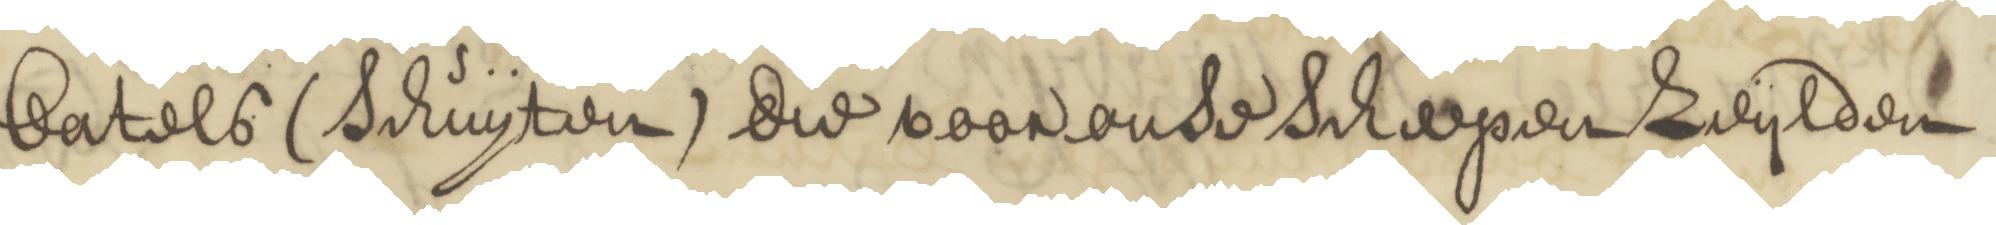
batels (schuijten) die voor onse scheepen zeijlden
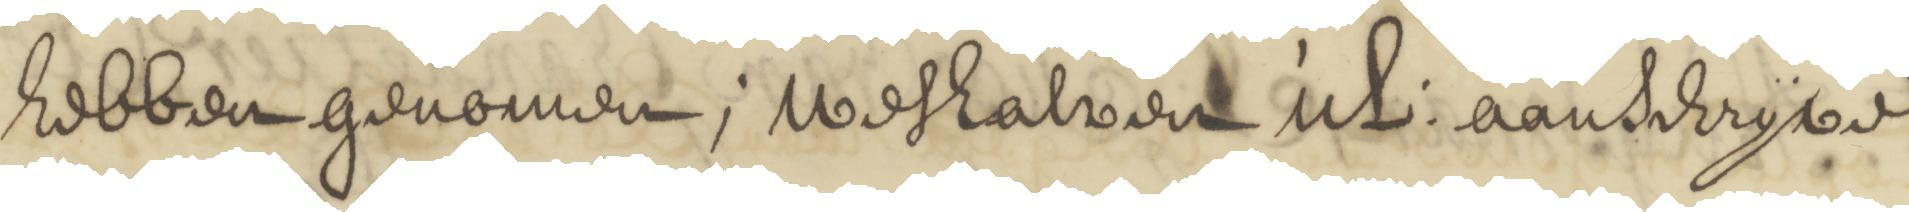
hebben genomen; weshalven uL: aanschrijve
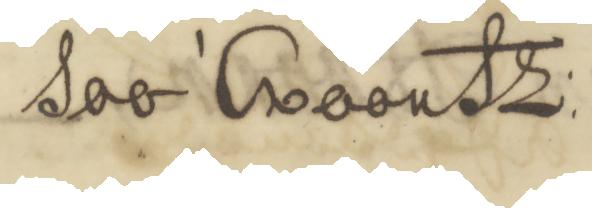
soo 't voorsz:
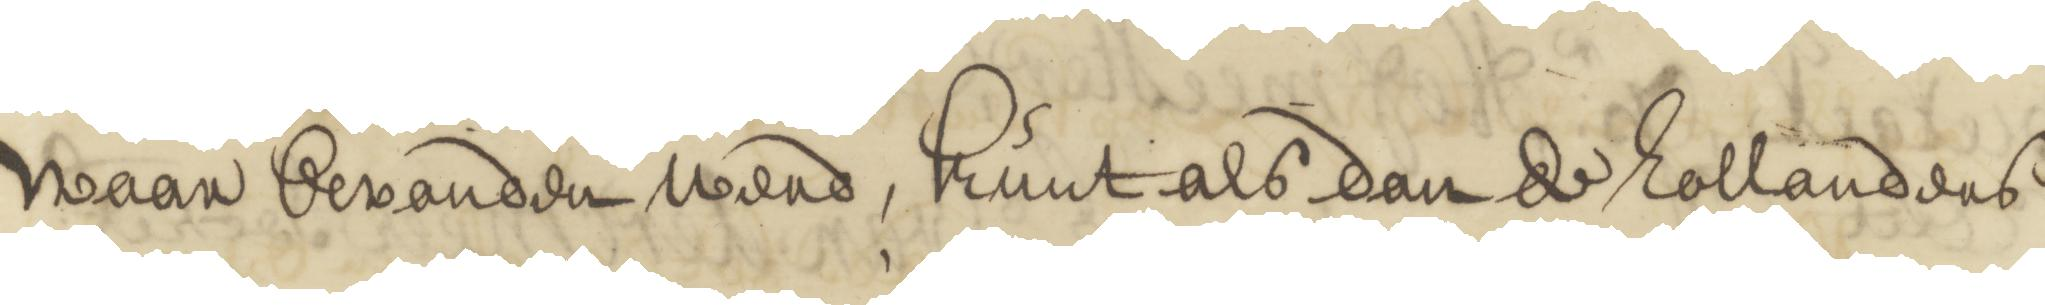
waar bevonden werd, kunt als dan de hollanders
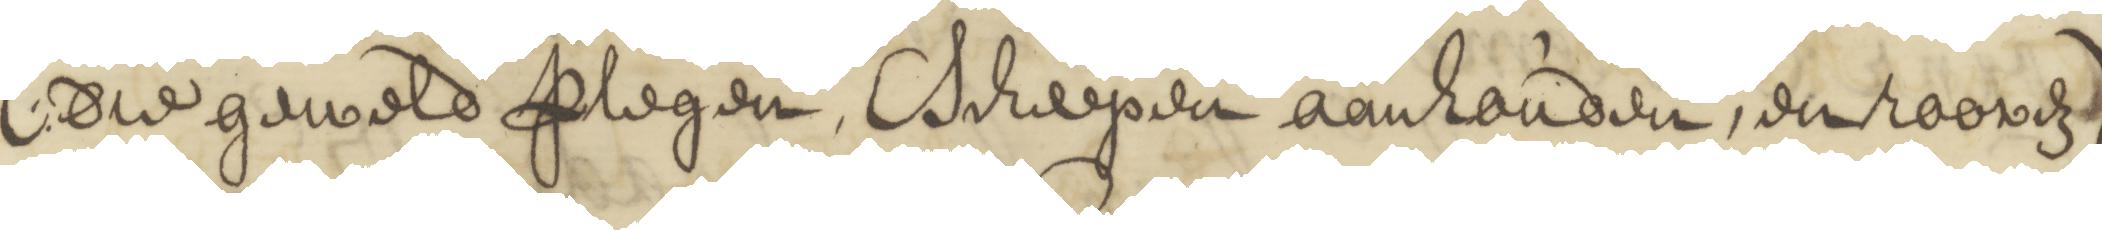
(:die geweld plegen, 't scheepen aanhouden, en rooven
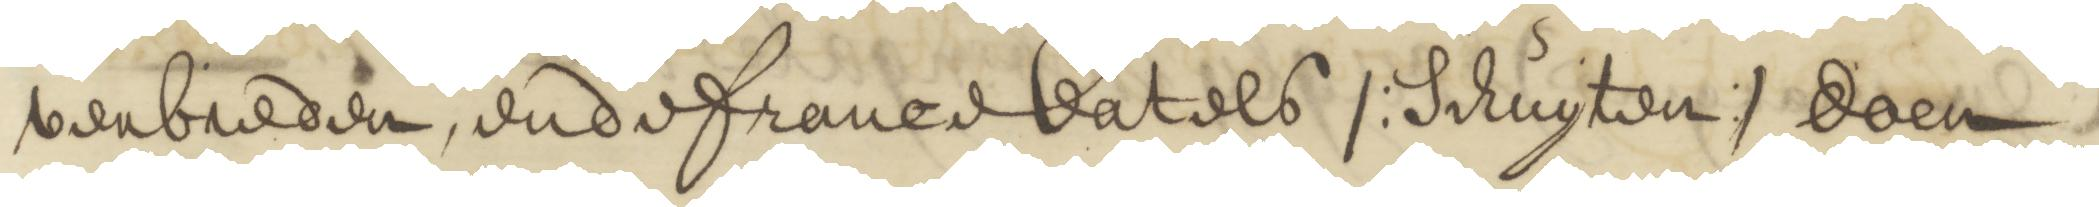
verbieden, en de france batels /: schuijten :/ doen
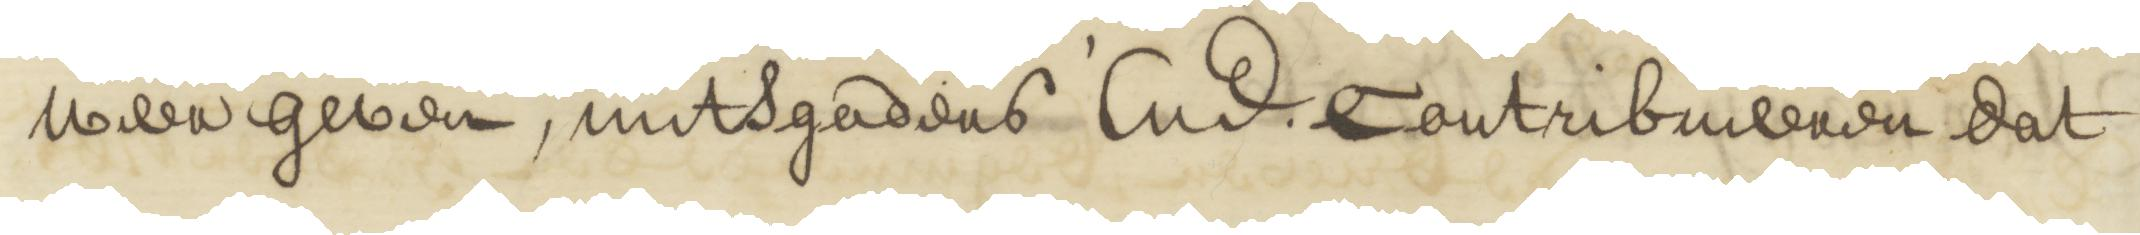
weer geven, mitsgaders 't uE. contribueeren dat
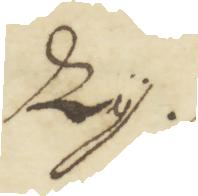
zij.
